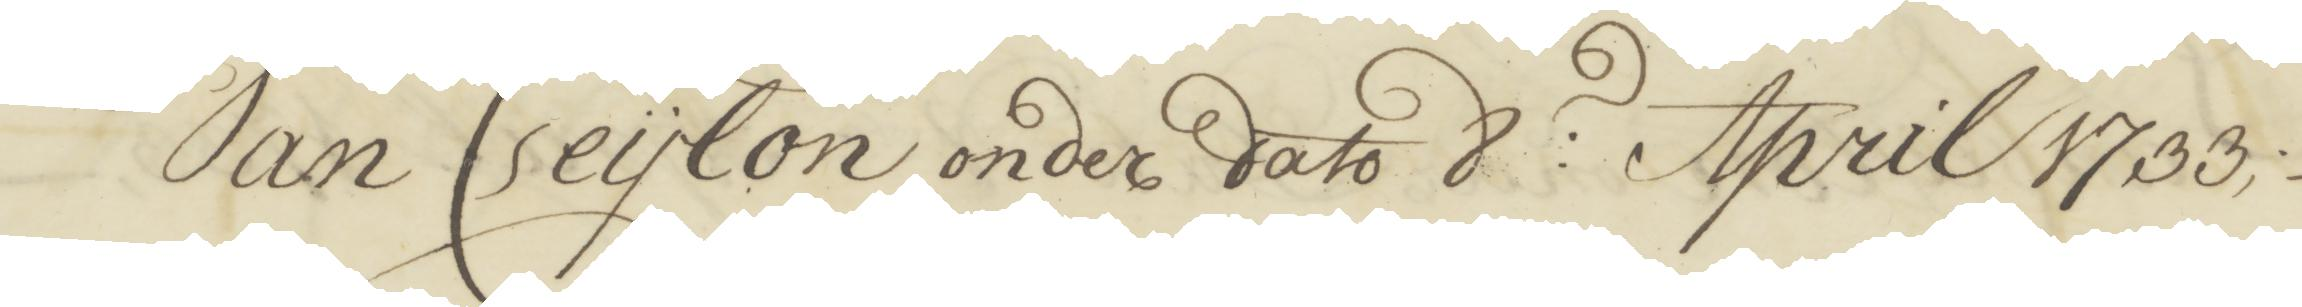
Van Ceijlon onder dato 8:e April 1733;
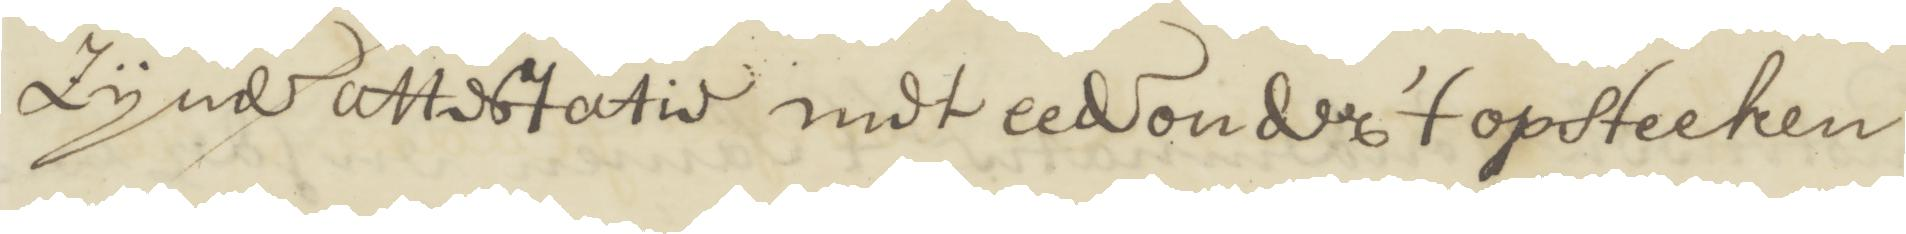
Zijnde attestatie met eede onder ’t opsteeken
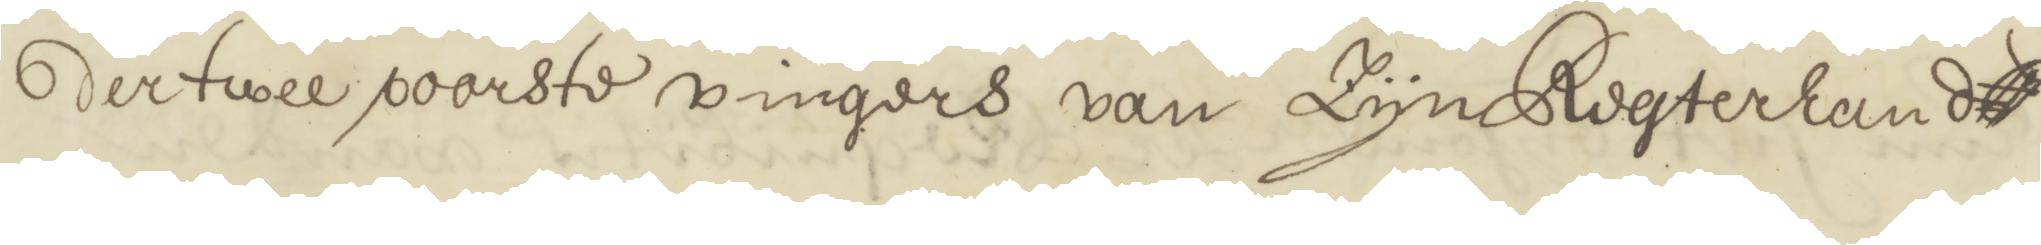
der twee voorste vingers van Zijn Regterhande
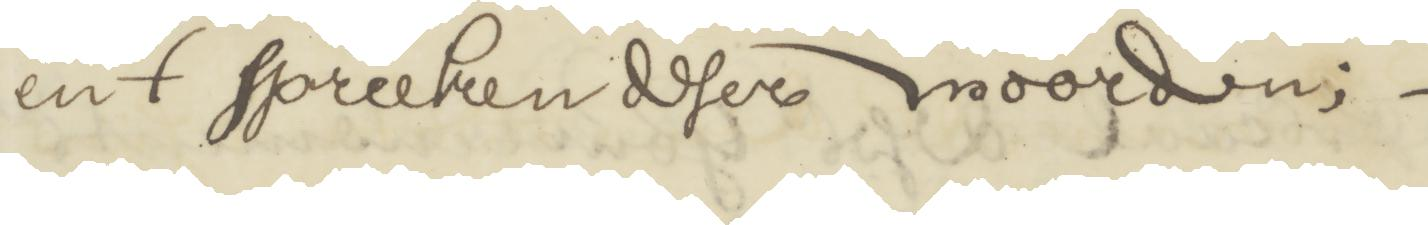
en ’t spreeken deser woorden; —
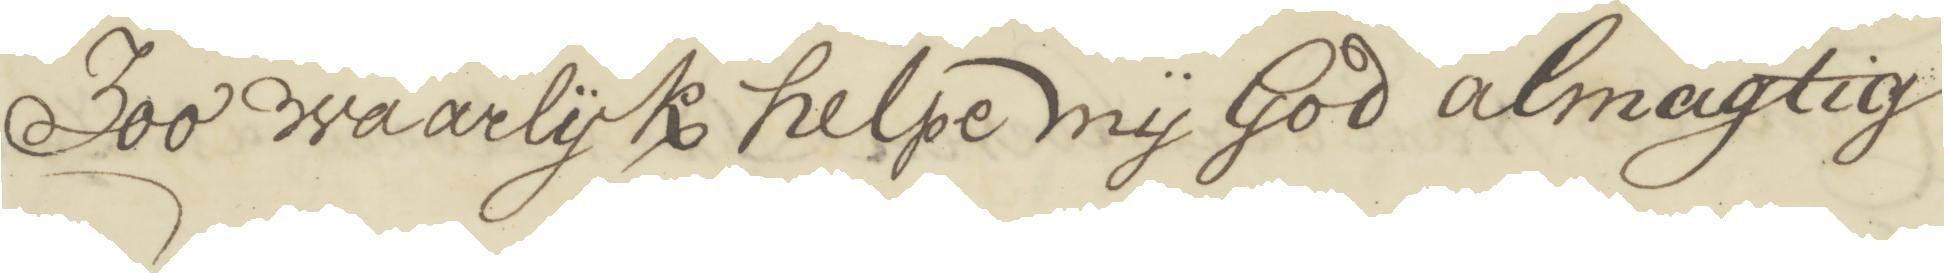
Zoo waarlijk helpe mij God almagtig
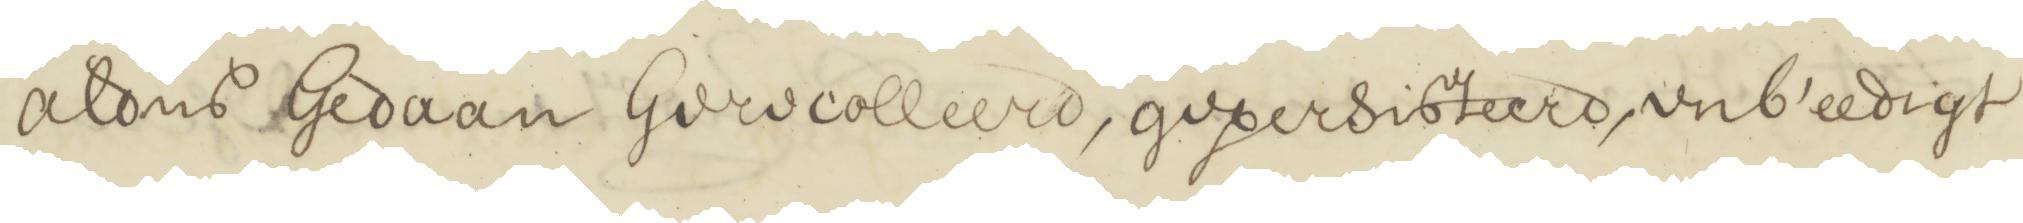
aldus Gedaan Gerecolleerd, gepersisteerd, en b'eedigt
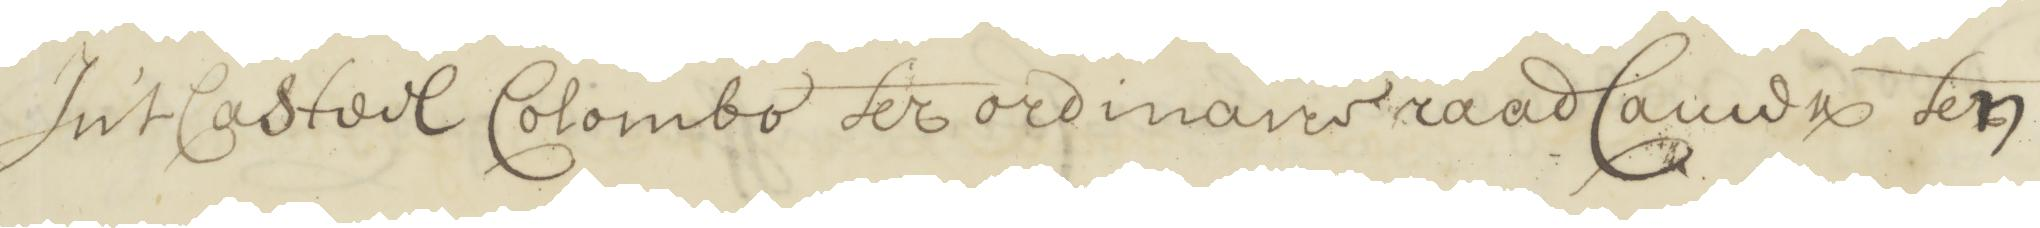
Jn’t Casteel Colombo ter ordinaire raadcamer ten
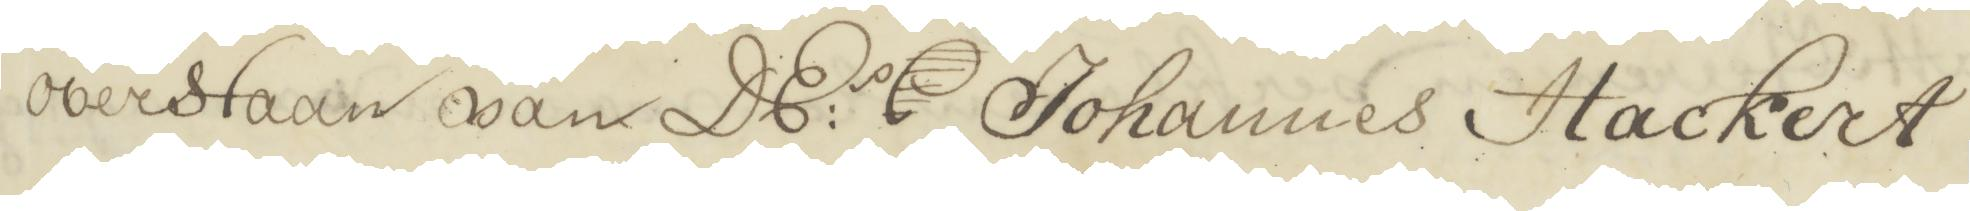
overstaan van DE:s C Johannes Hackert
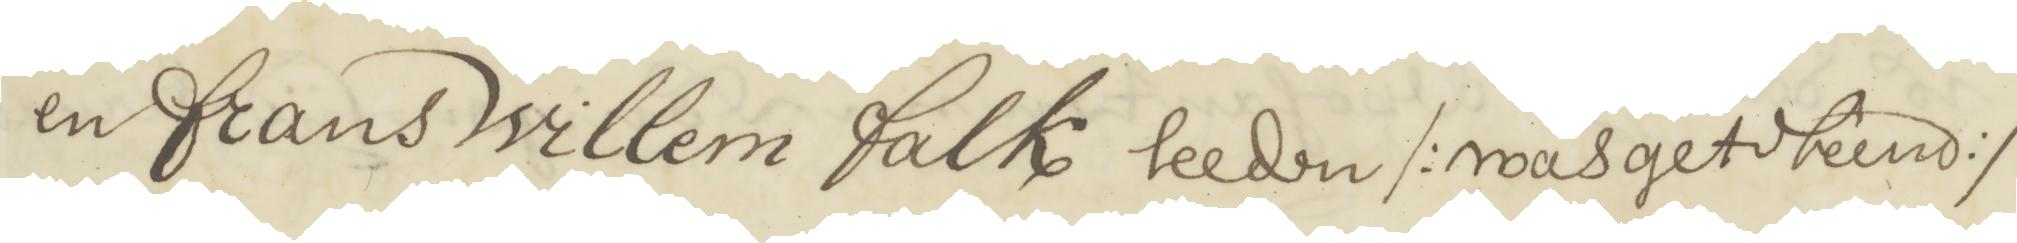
en frans Willem falk leeden /: was getekend:/
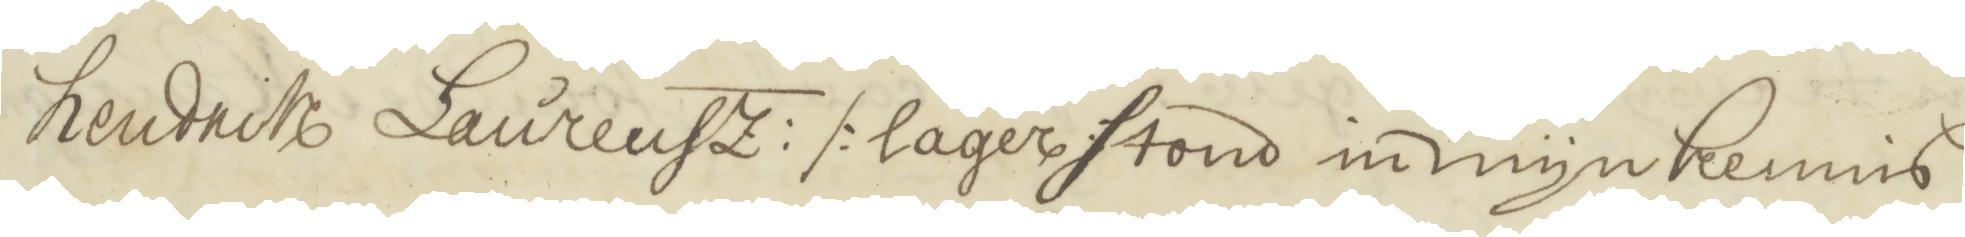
hendrik Laurensz: /: lager stond in mijn kennis
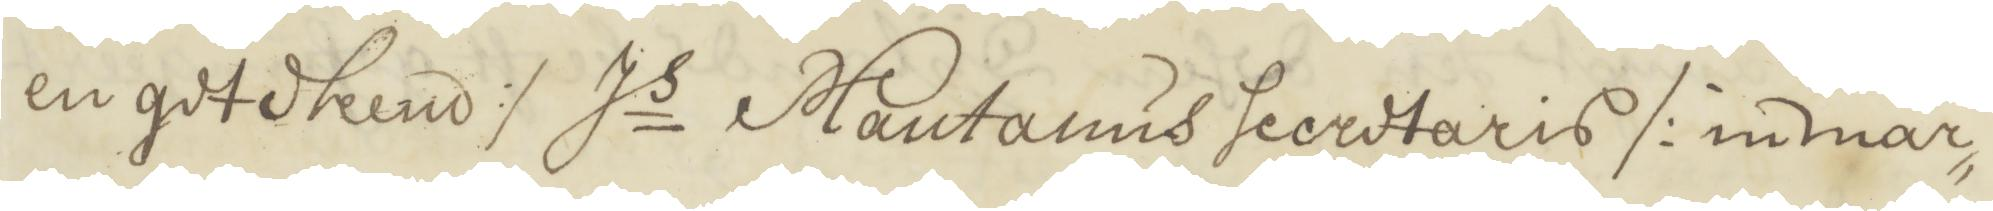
en getekend:/ J=s Mantanus secretaris /: in mar„
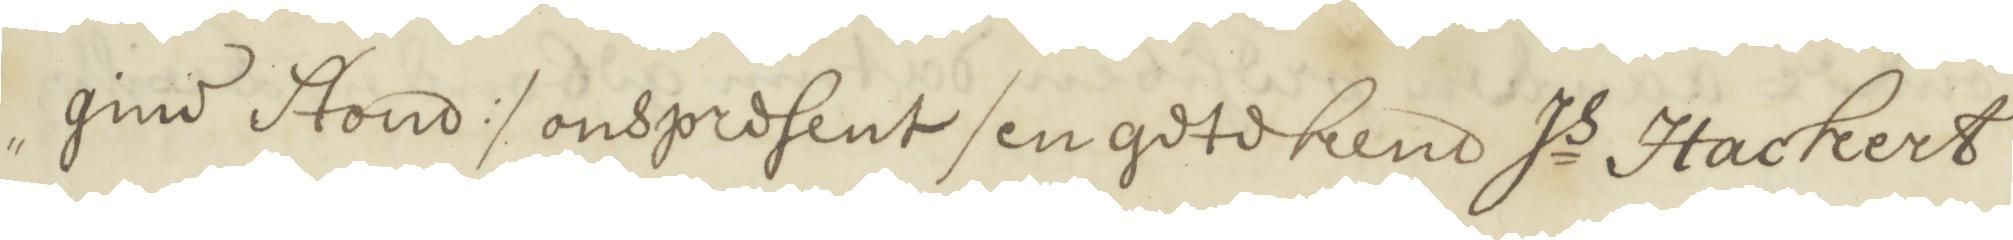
„gine stond :/ ons present / en getekend J=s Hackert
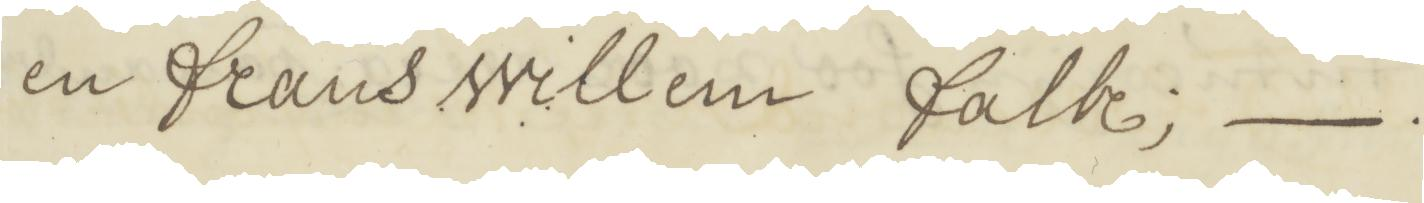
en frans willem falk; —.
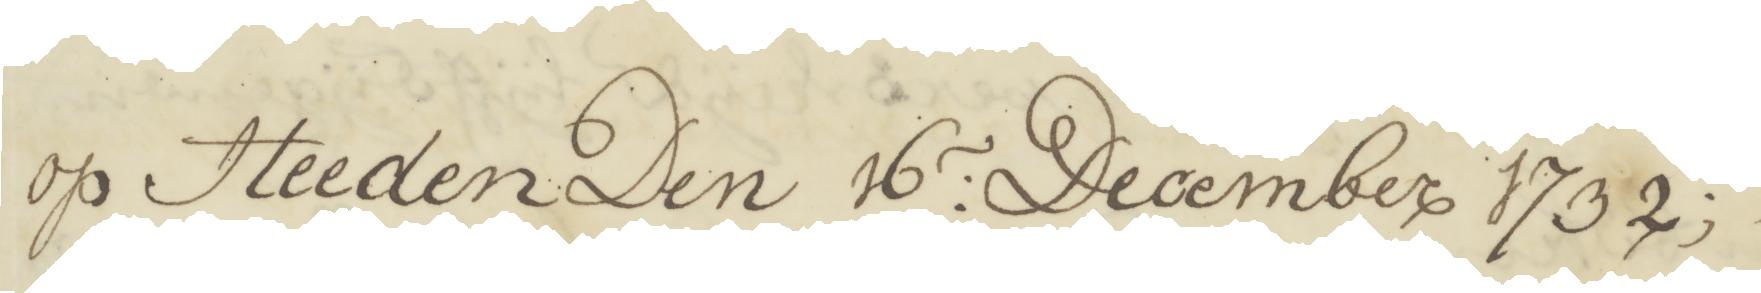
op Heeden Den 16:e December 1732;
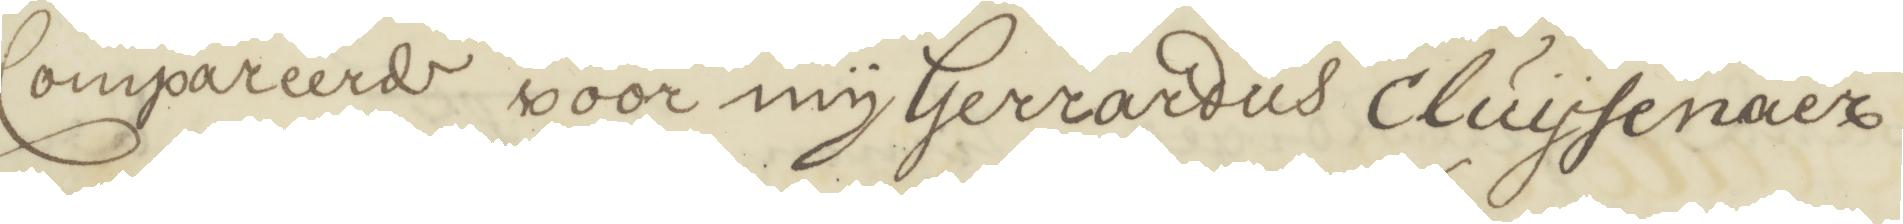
Compareerde voor mij Gerrardus Cluijsenaer
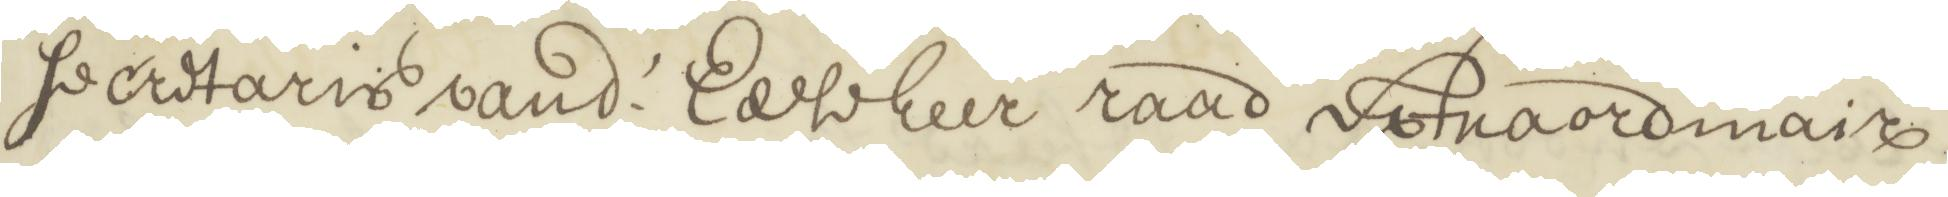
secretaris van d: Edele heer raad Extraordinair
